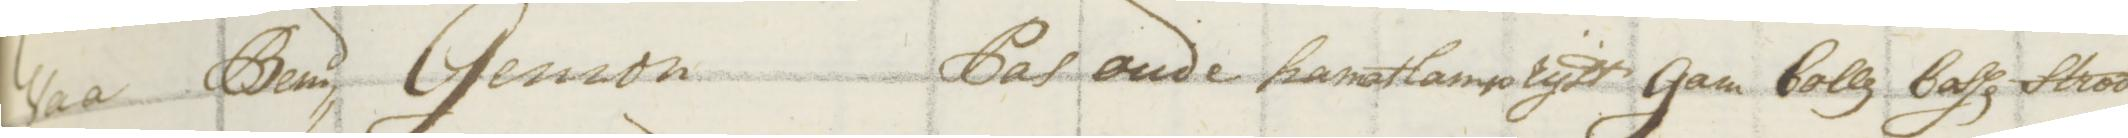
Vaa Bem„d Gemon Pas oude hamat lamp rijst gam bollen bassen stroo
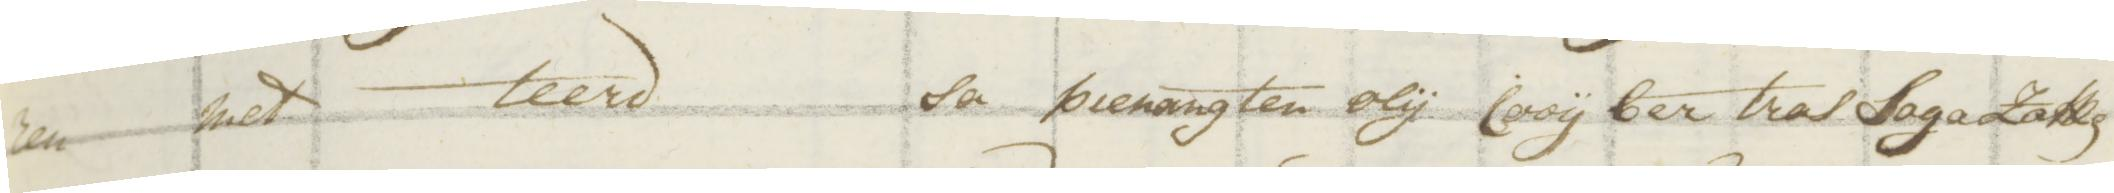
ren met teerd sa pienang ten olij Cooij ber tras Saga zakken
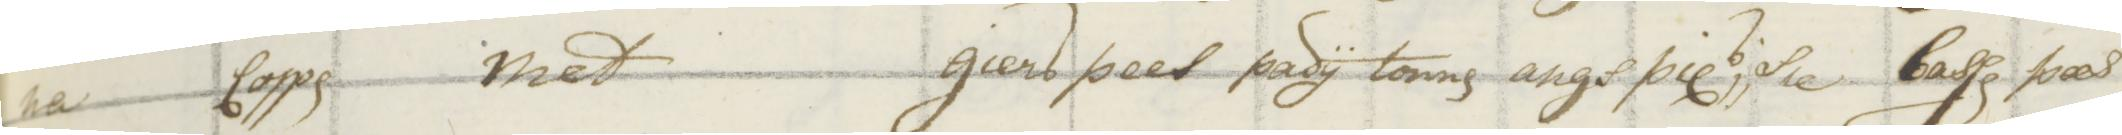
na Coppen met giers pees padij tonnen angs pic„s sie bassen pees
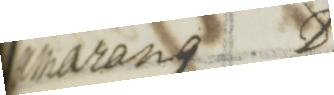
Samarang 8
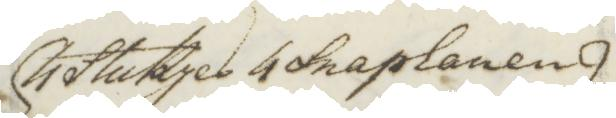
4 stukjes 4 snaphanen
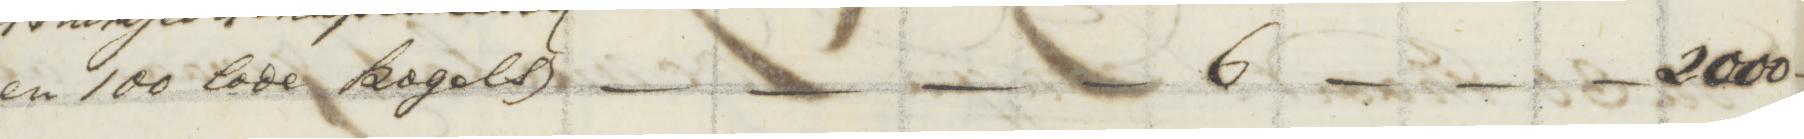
en 100 lode kogels — — — — 6 — — — 2000
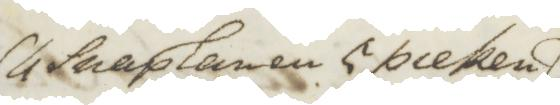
4 snaphanen 5 pieken
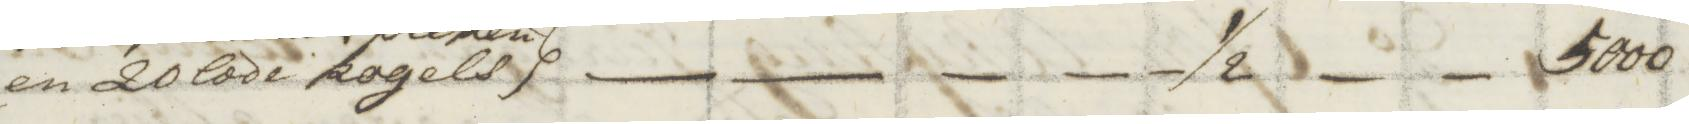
en 20 lode kogels — — — — –½ — — 5000
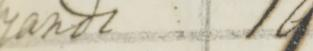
Tjandi 19
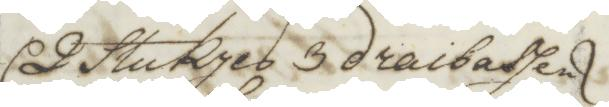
2 stukjes 3 draibassen
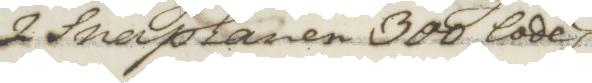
2 snaphanen 300 lode
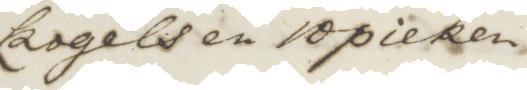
kogels en 10 pieken
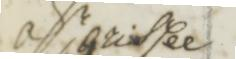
over„t grissee
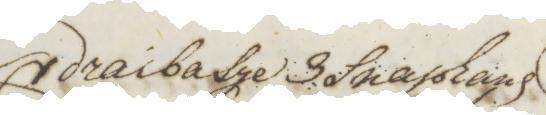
1 draibasje 3 snaphanen
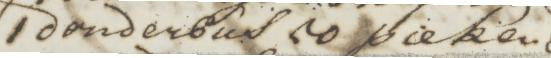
1 donderbus 50 pieken
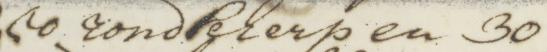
50 rondscherp en 30
